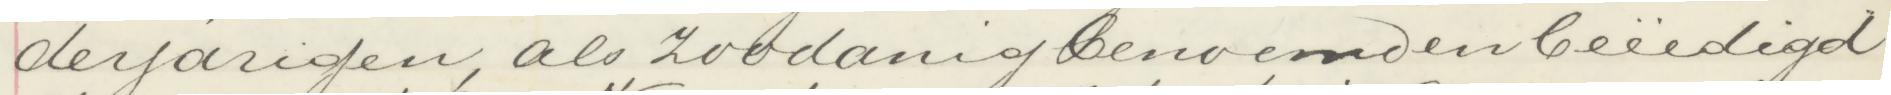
derjarigen als zoodanig benoemd en beëedigd
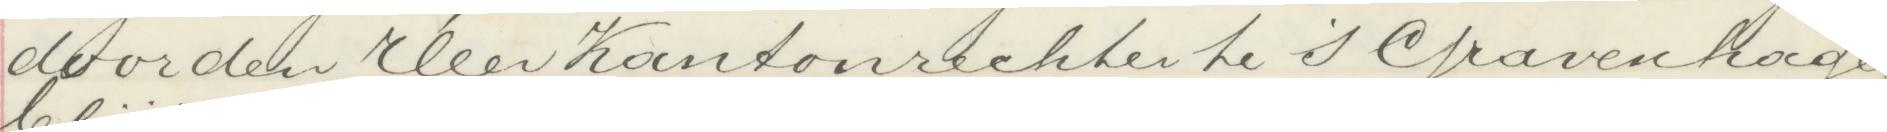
door den Heer Kantonrechter te 's Gravenhage,
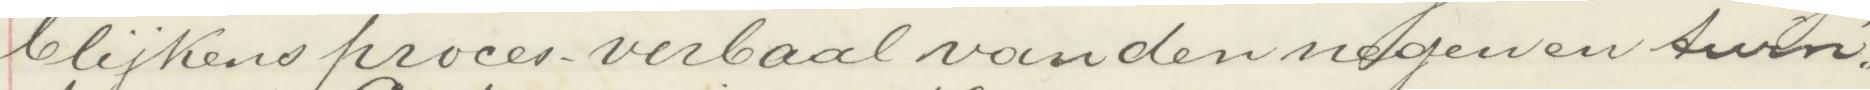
blijkens proces-verbaal van den negen en twin
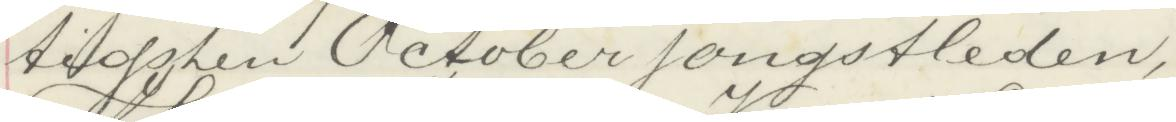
tigsten October jongstleden,
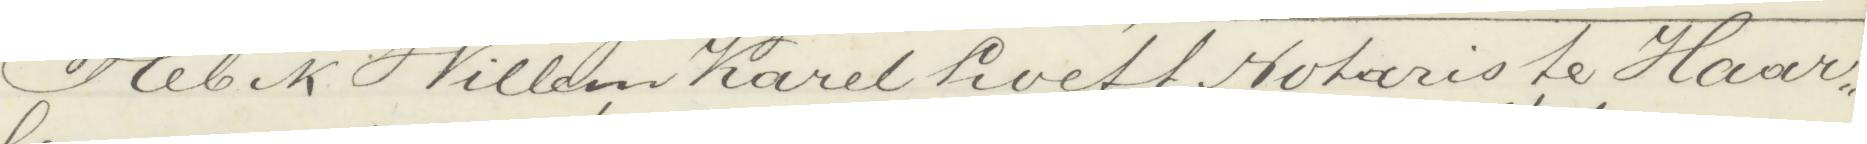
Heb ik Willem Karel Loeff, Notaris te Haar„
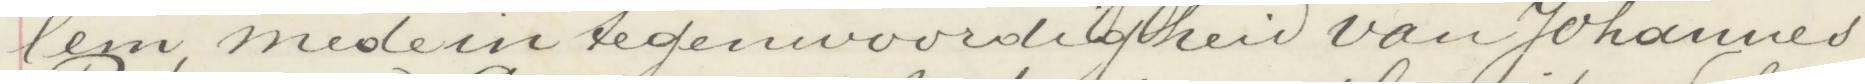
lem, mede in tegenwoordigheid van Johannes
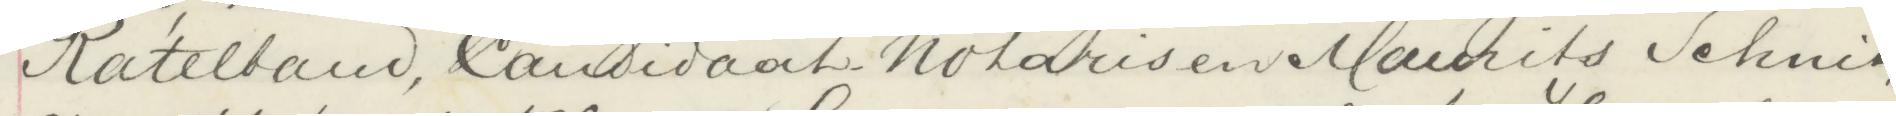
Ratelband, Candidaat - Notaris en Maurits Schnit
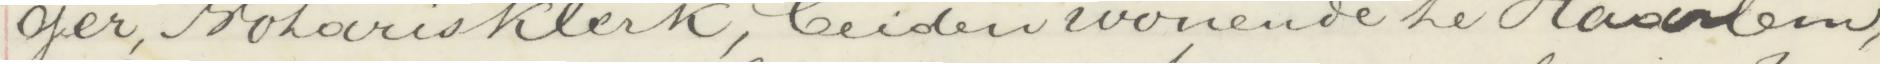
ger Notarisklerk, beiden wonende te Haarlem
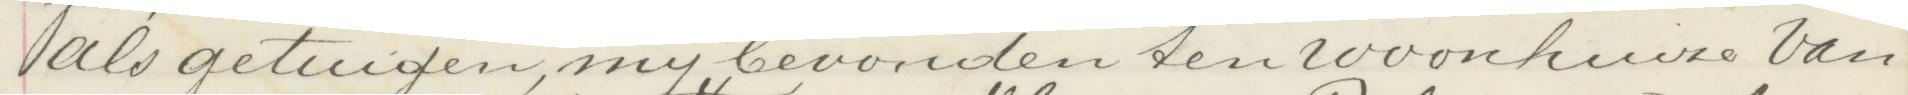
als getuigen, mij bevonden ten woonhuize van
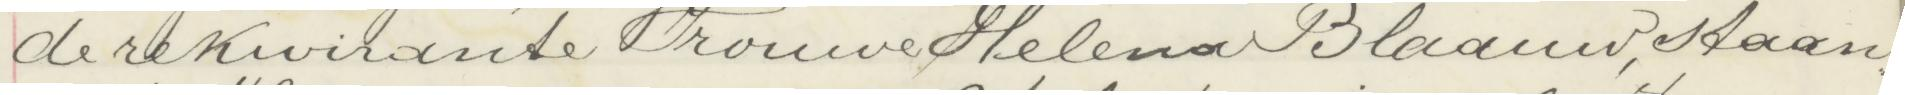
de rekwirante Vrouwe Helena Blaauw, staan„
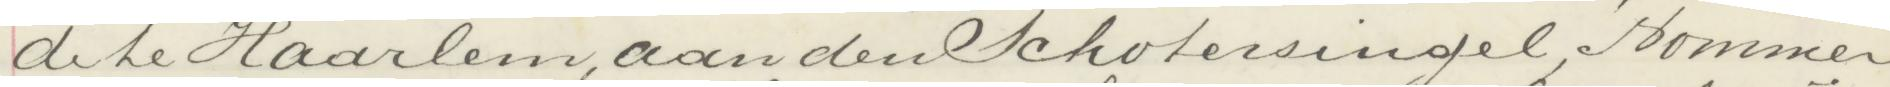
de te Haarlem, aan den Schotersingel, Nommer
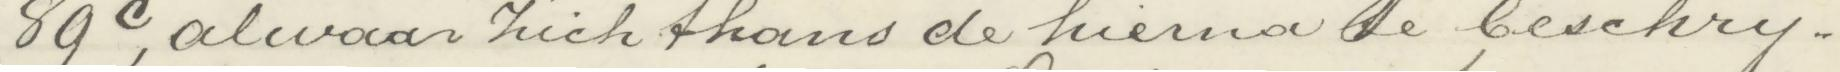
89c, alwaar zich thans de hierna te beschrij-
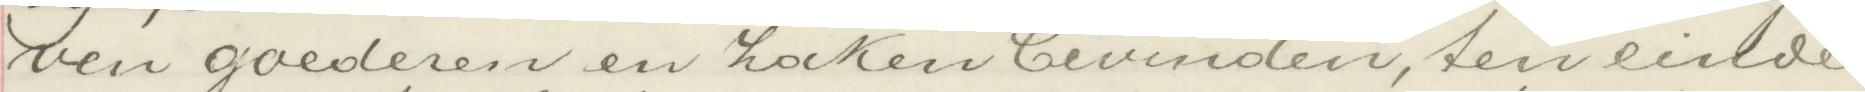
ven goederen en zaken bevinden, ten einde
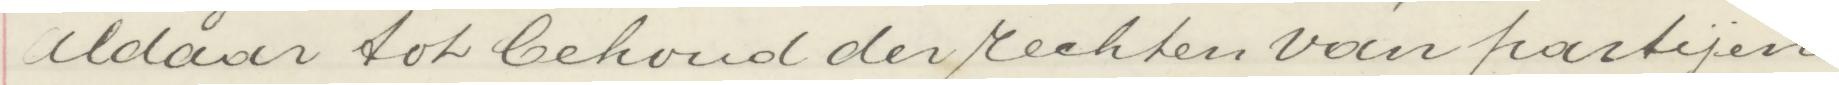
aldaar tot behoud der rechten van partijen
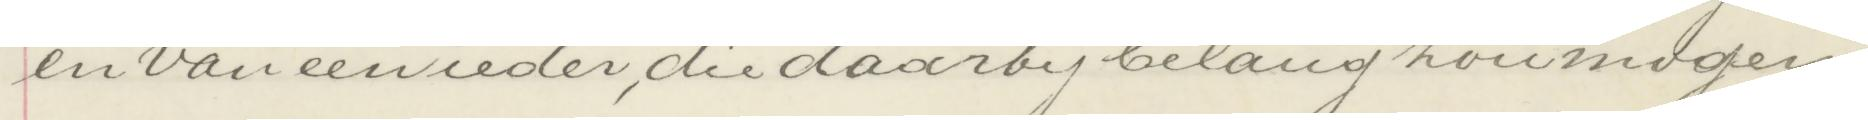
en van een ieder, die daarbij belang zou mogen
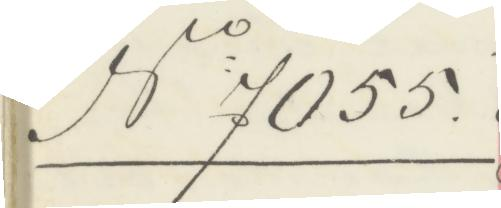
N=o 7055.
